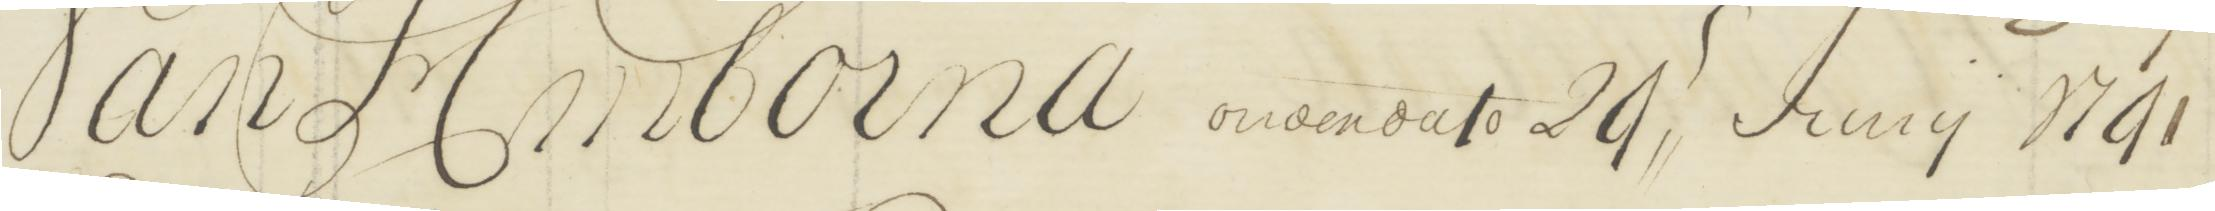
Van Amboina onder dato 24„' Iunij 1741
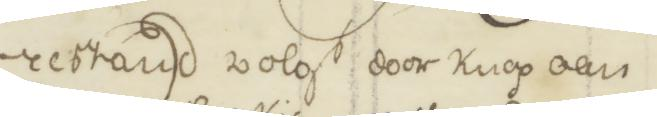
restand volg:s door Knop aan
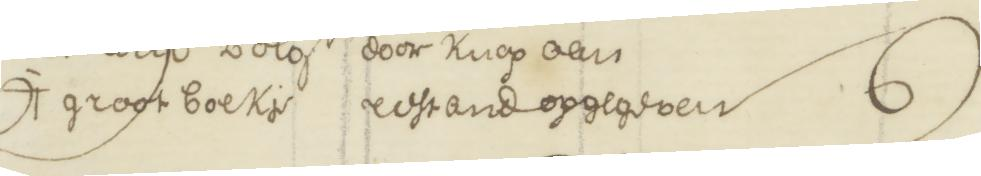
t groot boekje restand opgegeven
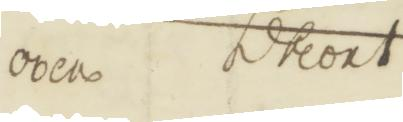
over tekort
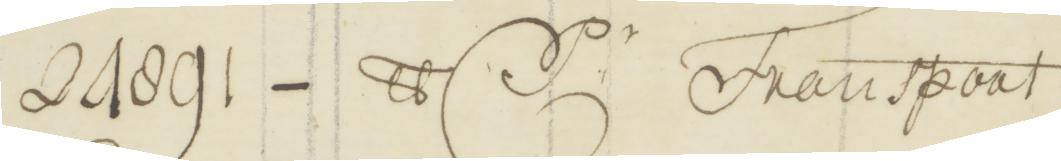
24891 — lb P„r Transport
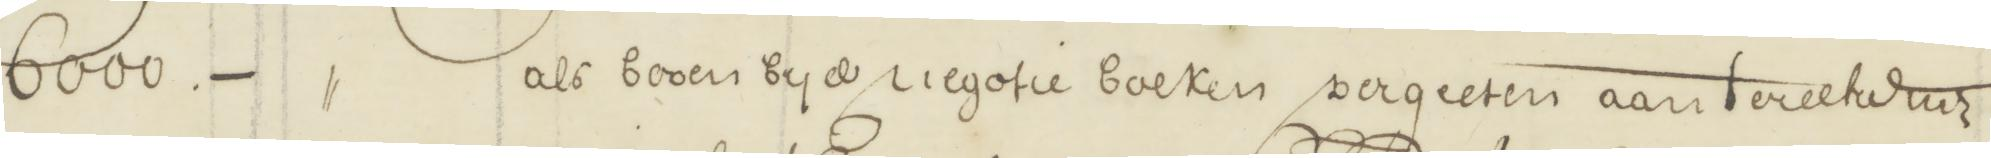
6000 — „ als boven by de negotie boeken vergeeten aan tereekenen
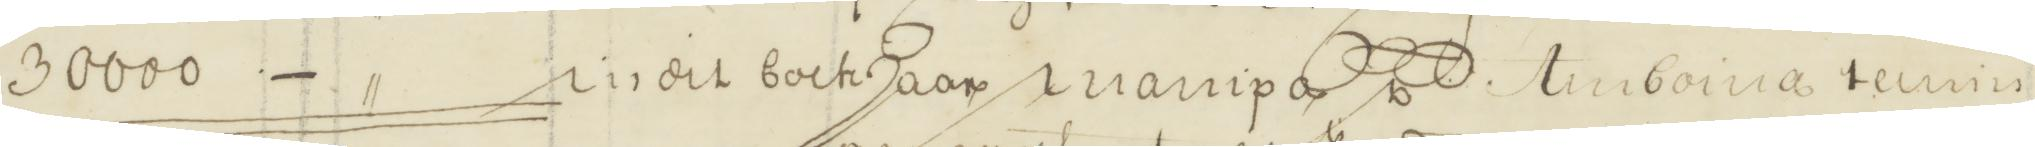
30000 — „ in dit boek Jaar manipa v. Amboina temin
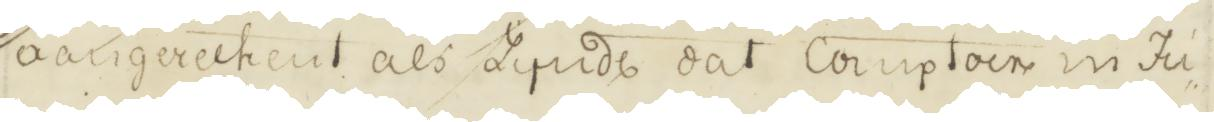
aangereekent als Zynde dat Comptoir in Iu„
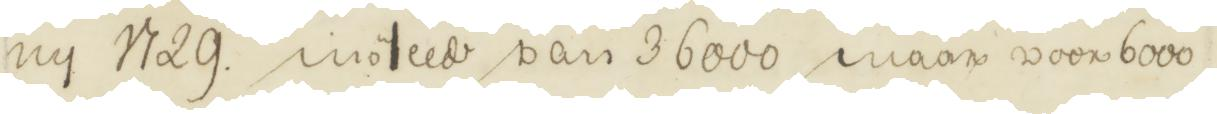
ny 1729. insteede van 36000 maar voor 6000
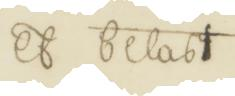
lb belast
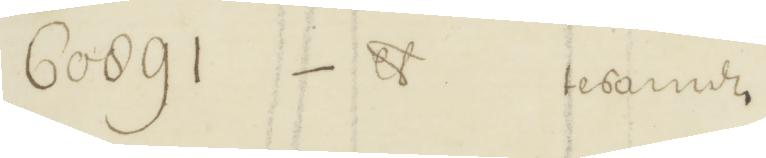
60891 — lb tesamen
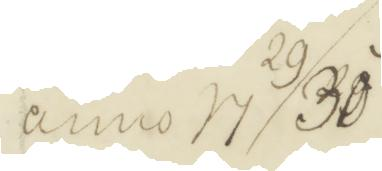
anno 17 29/ en 30
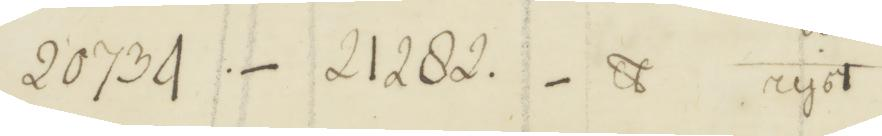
20734 — 21282. — lb rijst
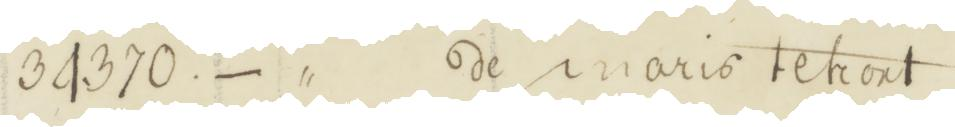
34370. — „ de maris tekort
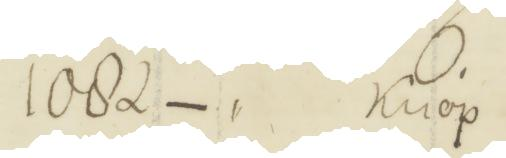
1082 — „ Knop —:o
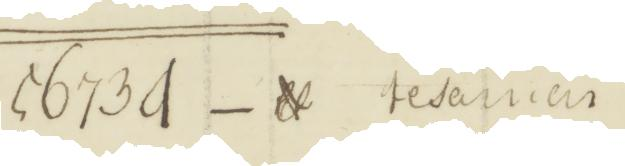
56734 — lb tesamen
